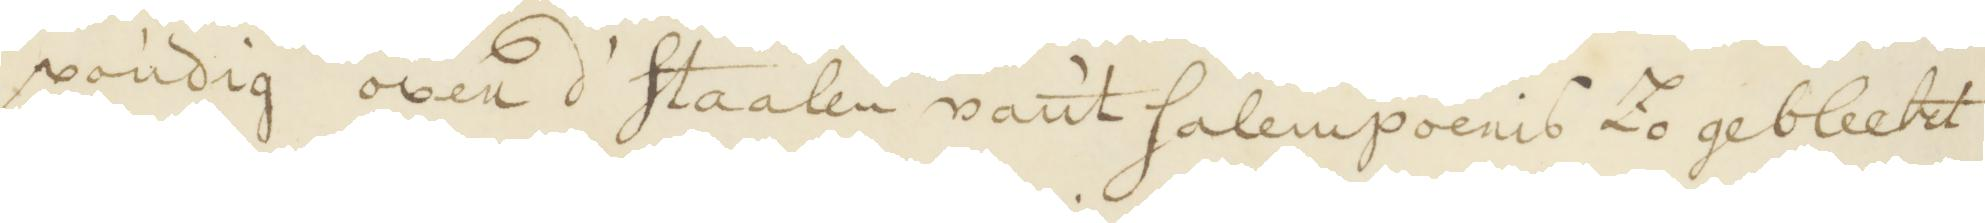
„voudig over d’ Staalen van't salempoeris Zo gebleekt
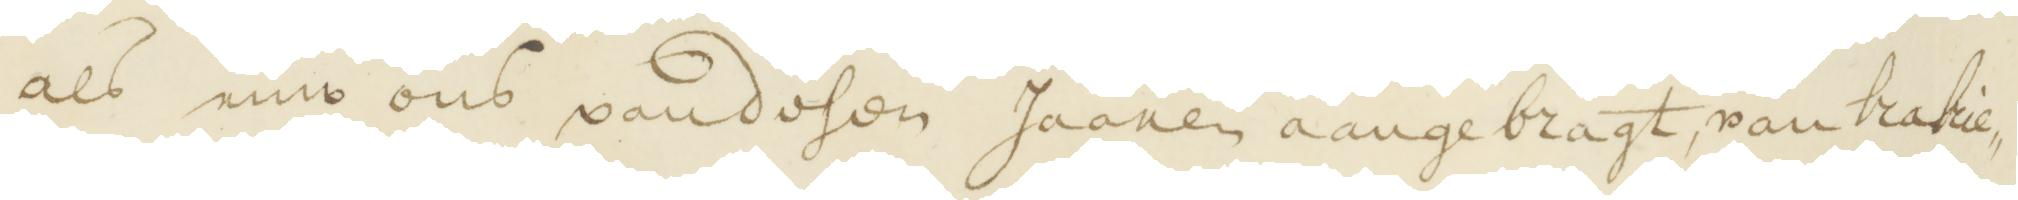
als ruw ons van desen Jaaren aangebragt, van kakie„
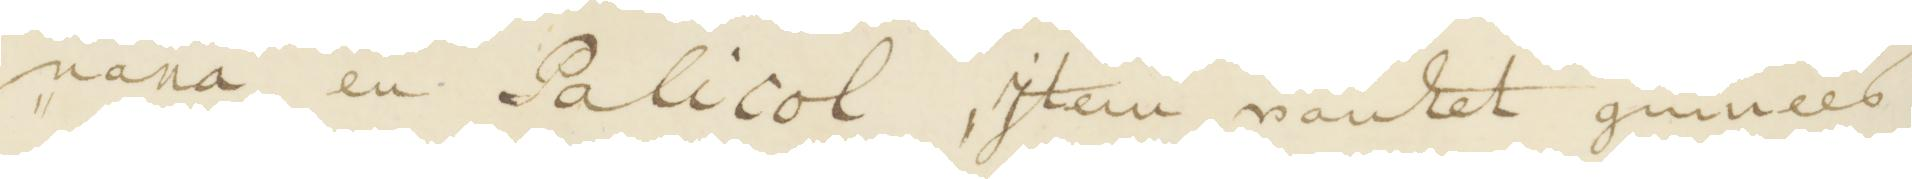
„nara en Palicol, jtem van het guinees
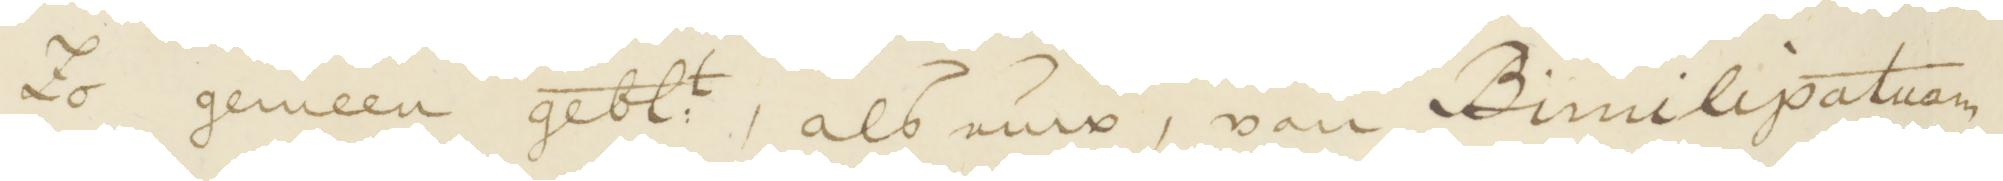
zo gemeen gebl:t, als ruw, van Bimilipatnam
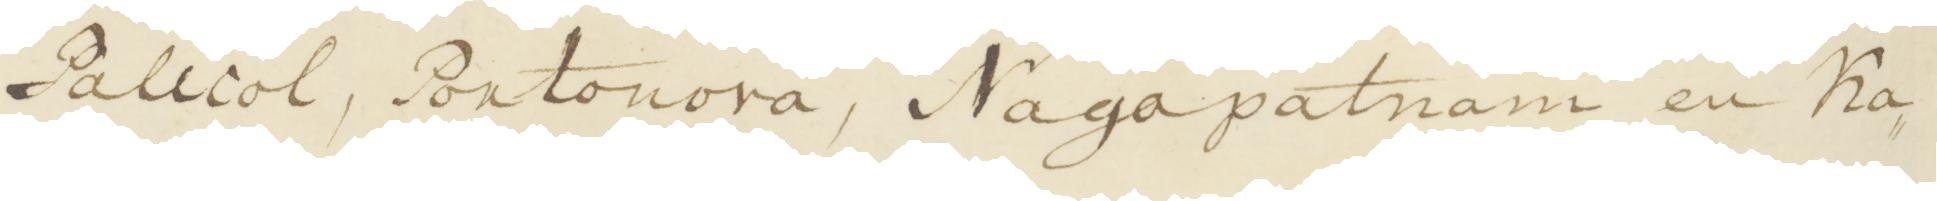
Palicol, Portonora, Nagapatnam en Ka„
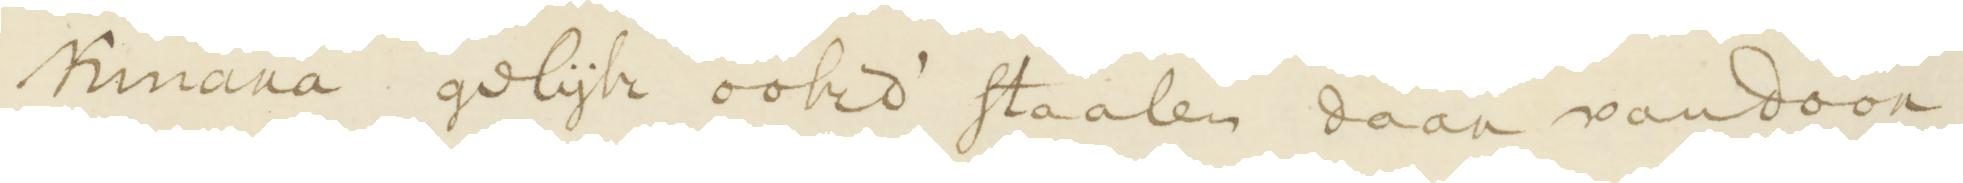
Kinara gelijk ook d’ staalen daar van door
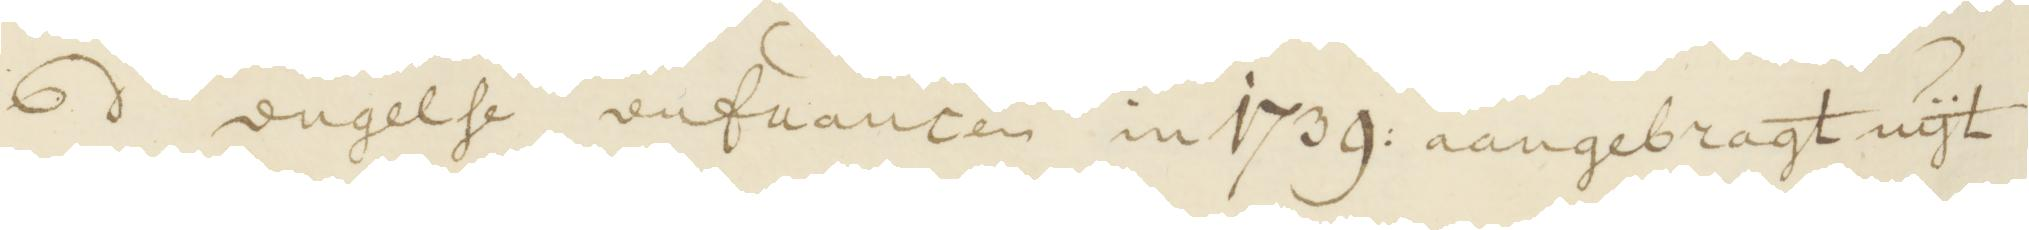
d' engelse en francen in 1739: aangebragt uijt
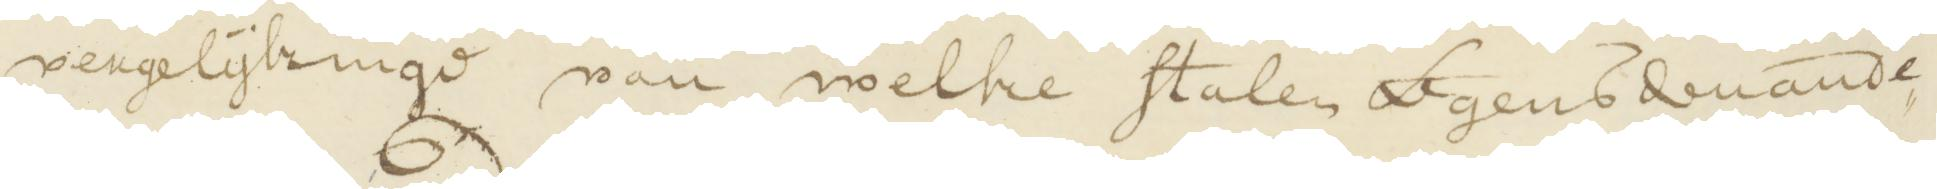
vergelijkinge van welke Stalen tegens den ande„
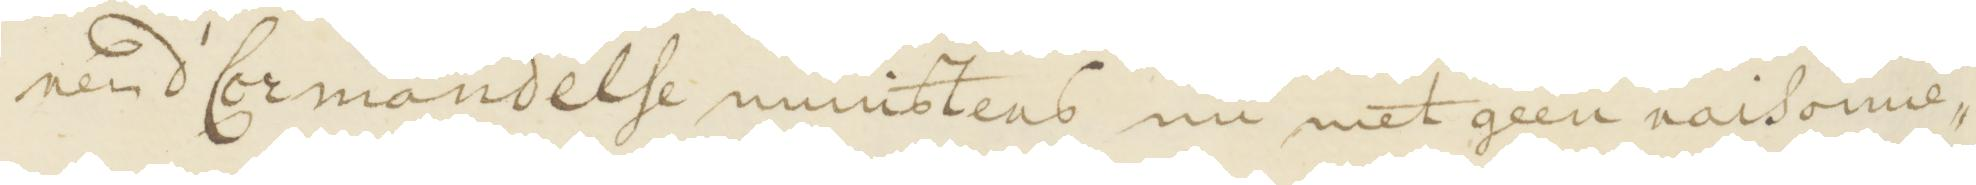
ren d’ Cormandelse ministers nu met geen raisonne„
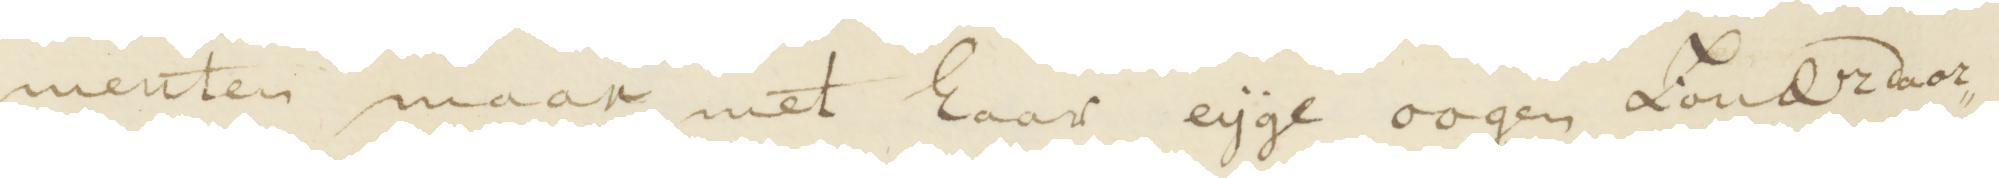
menten maar met haar eijge oogen Zonder daar„
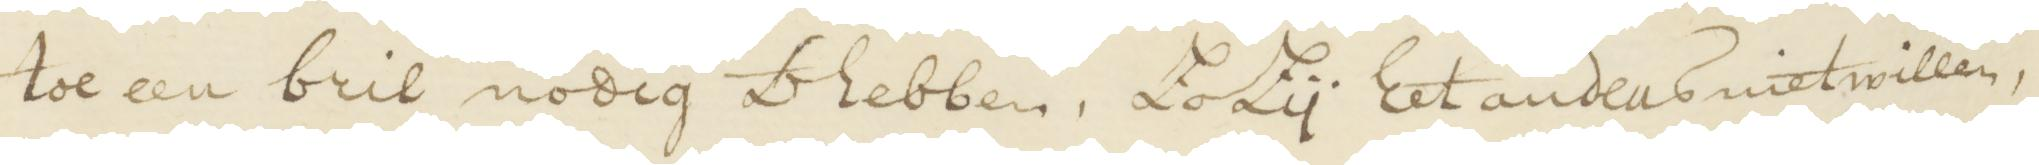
toe een bril nodig te hebben, Zo Zij het anders niet willen,
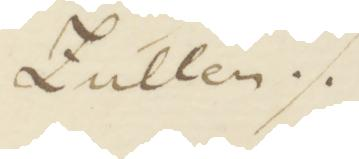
Zullen
